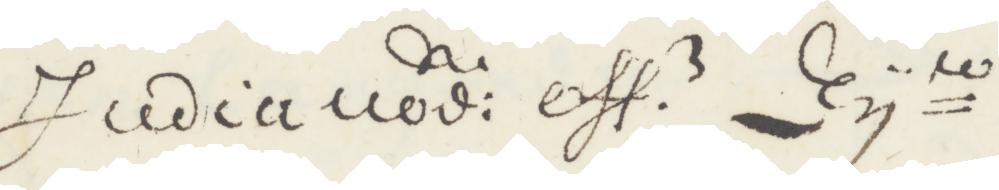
Jndia noe:' off.' Eij=r
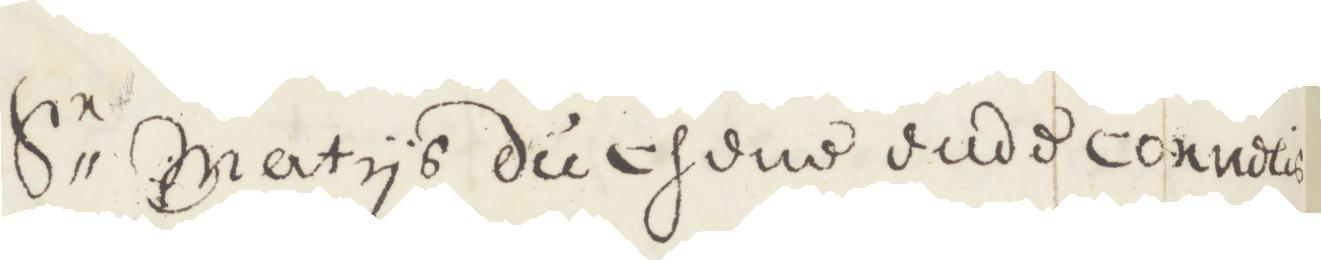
S„r Matijs duchene ende cornelis
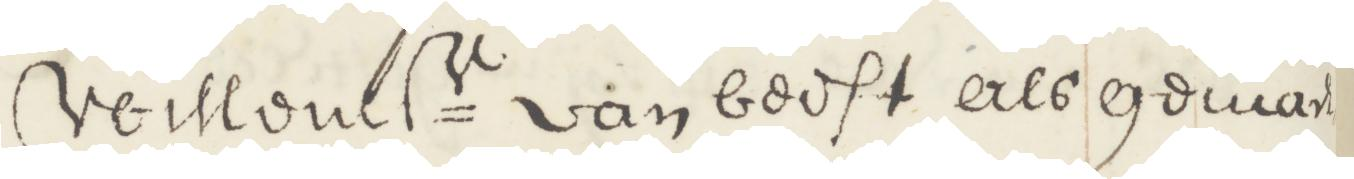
willems=ze van beest als gemach
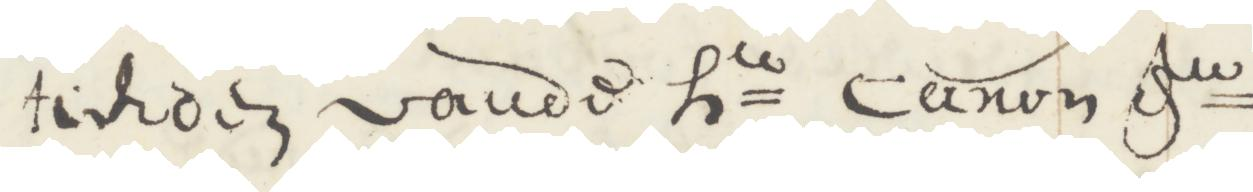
tichden vande h=r caron ver=te
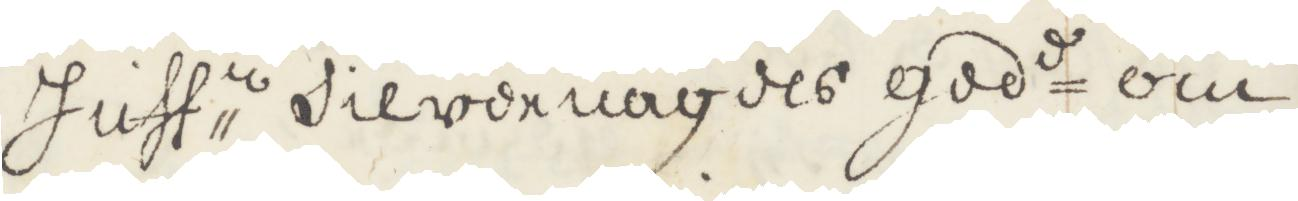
Juff„r Silvernagels ged=e om
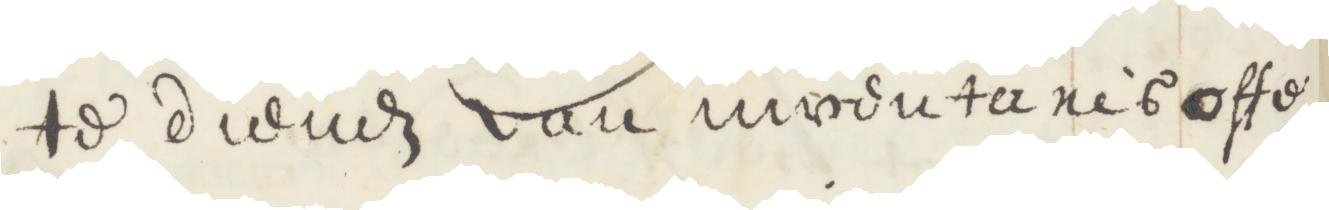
te dienen van inventaris ofte
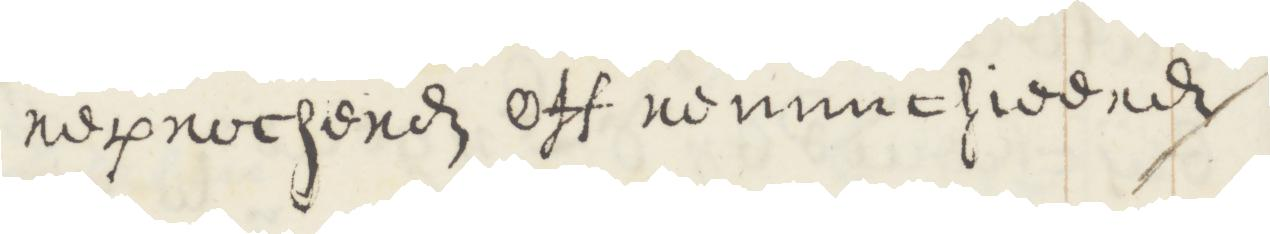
reprocheren off renunchieeren/
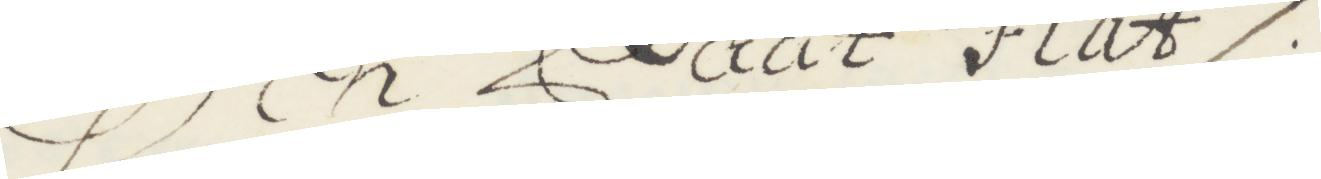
Den Raat Fiat /.
